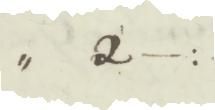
„ 2 —:
